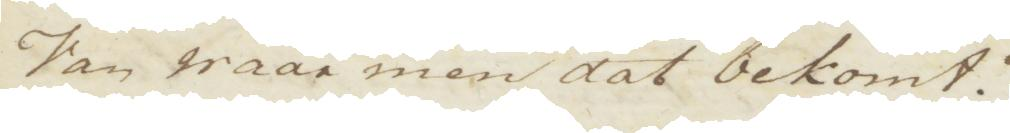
Van waar men dat bekomt.
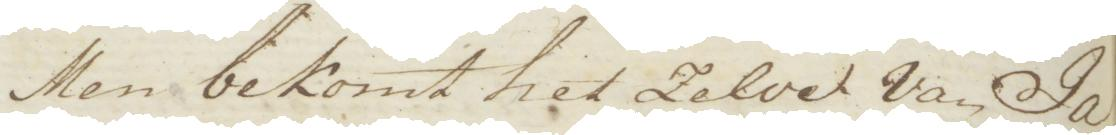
Men bekomt het zelve van Ja
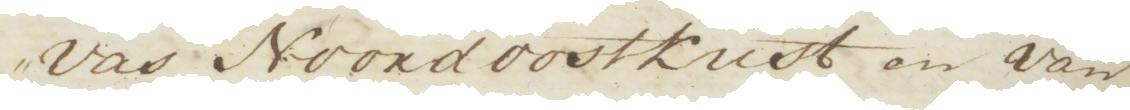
„vas Noordoostkust en van
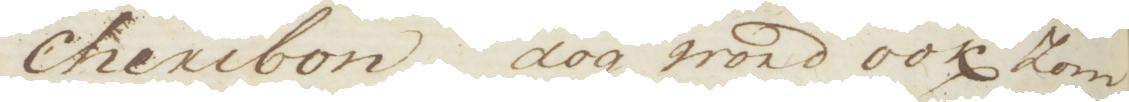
Cheribon dog word ook Zom
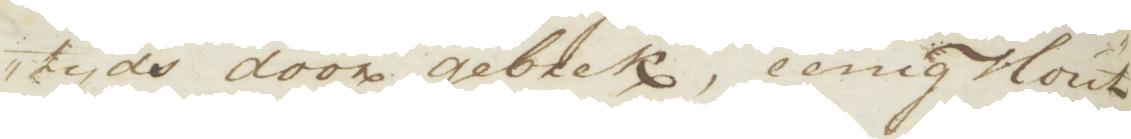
„tijds door gebrek, eenig Hout
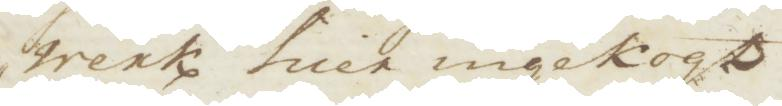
„werk hier ingekogt
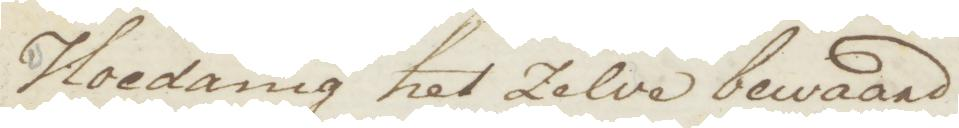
Hoedanig het zelve bewaard
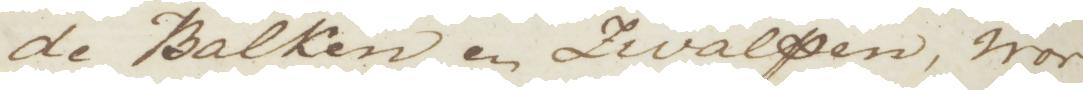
de Balken en Zwalpen, wor
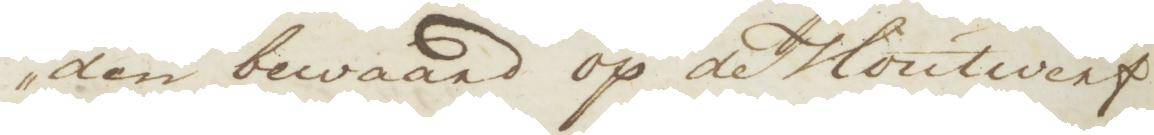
„den bewaard op de Houtwerf
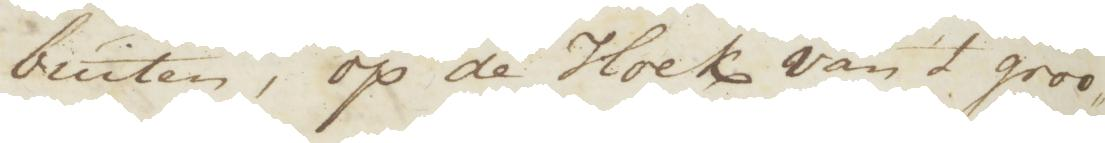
buiten, op de Hoek van ’t groo„
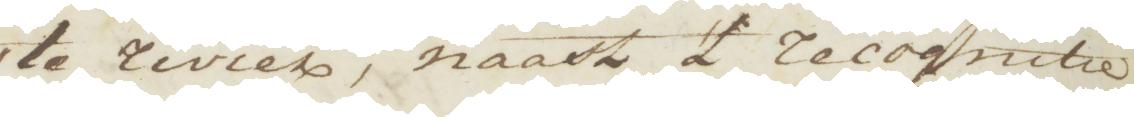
te rivier, naast 't recognitie
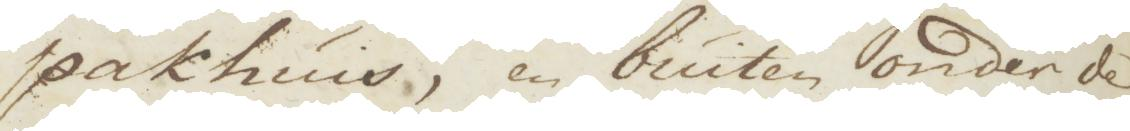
pakhuis, en buiten onder de
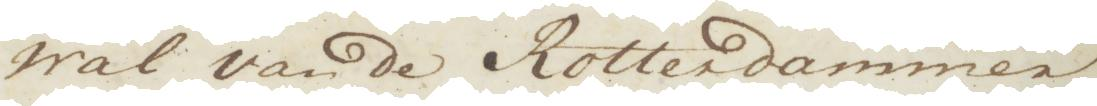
wal van de Rotterdammer
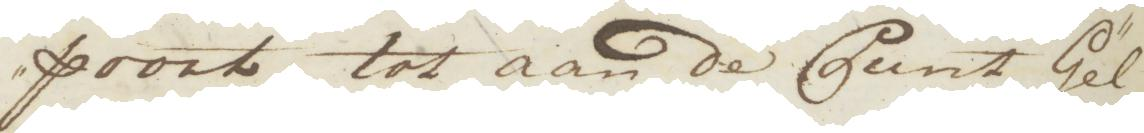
„poort tot aan de Punt Gel
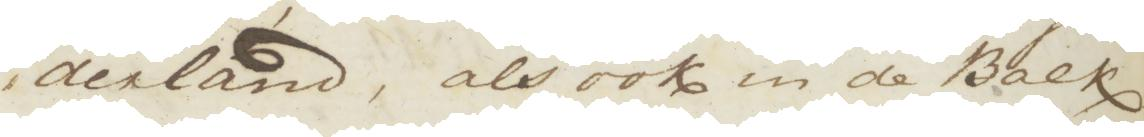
„derland, als ook in de Balk
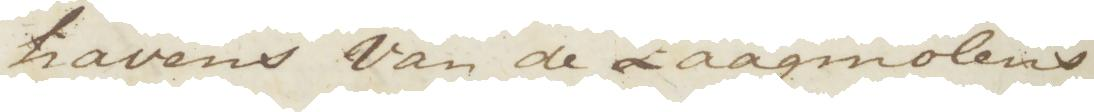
havens van de Zaagmolens
